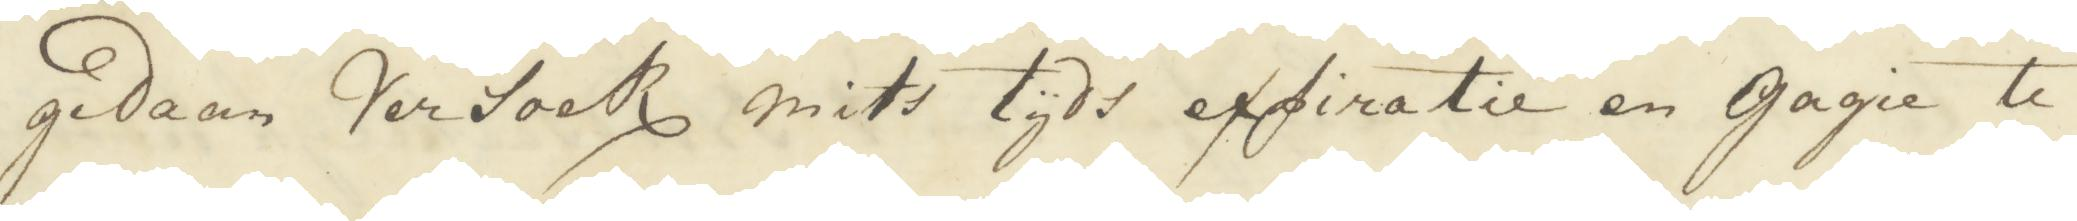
gedaan versoek mits tijds expiratie en gagie te
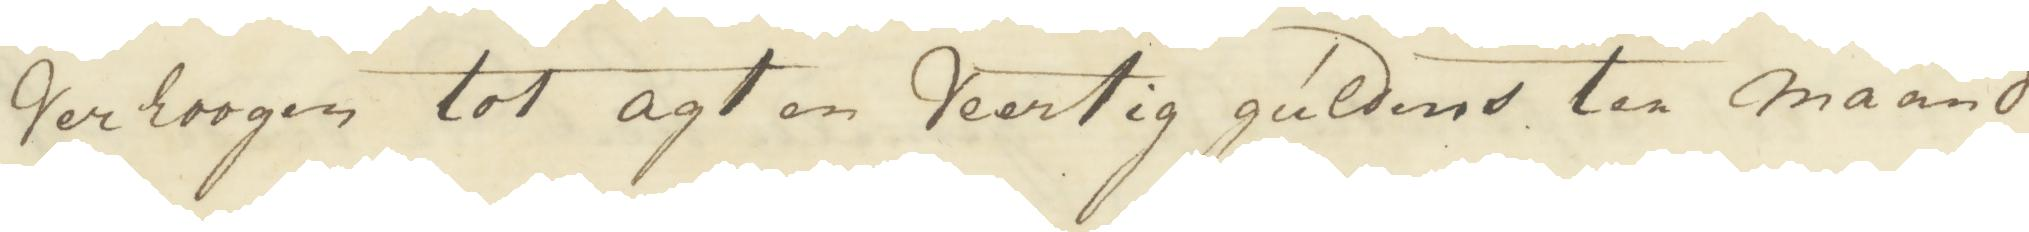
verhoogen tot agt en veertig guldens ter maand
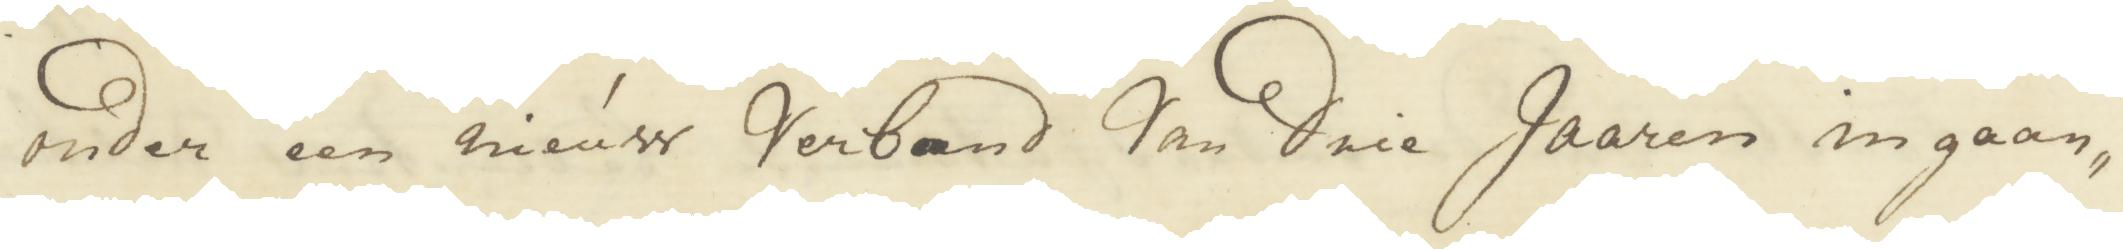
onder een nieuw verband van drie Jaaren in gaan„
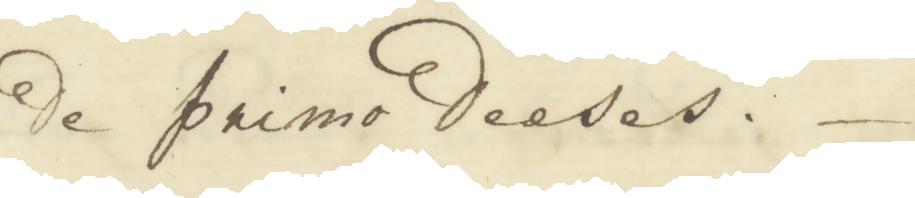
de primo deeses. —
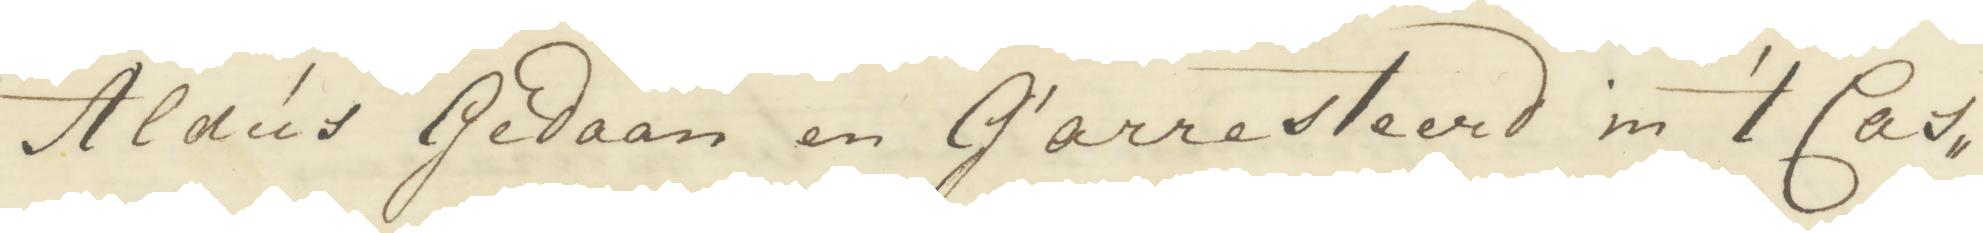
Aldus Gedaan en G'arresteerd in ’t Cas„
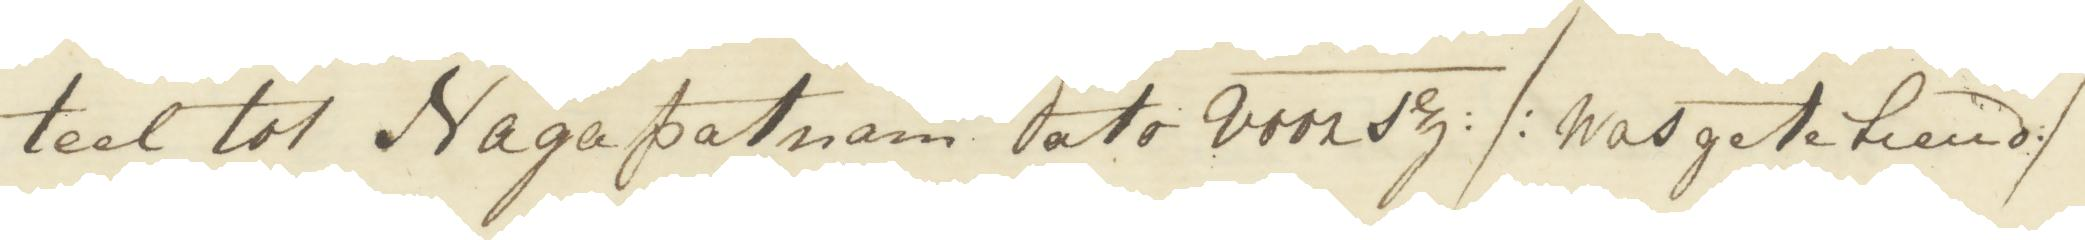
teel tot Nagapatnam dato voorsz: /:was getekend:/
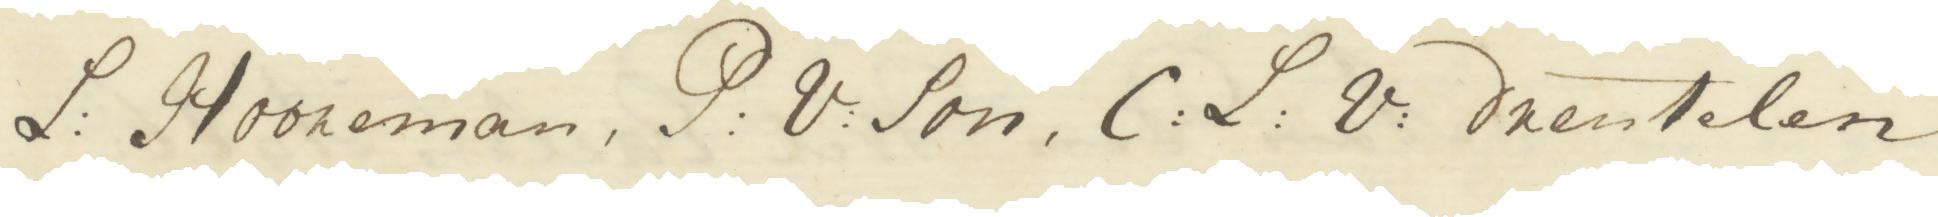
L: Hooreman, P: V: son, C: L: V: drentelen
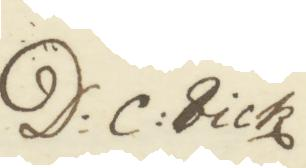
D: C: vick
